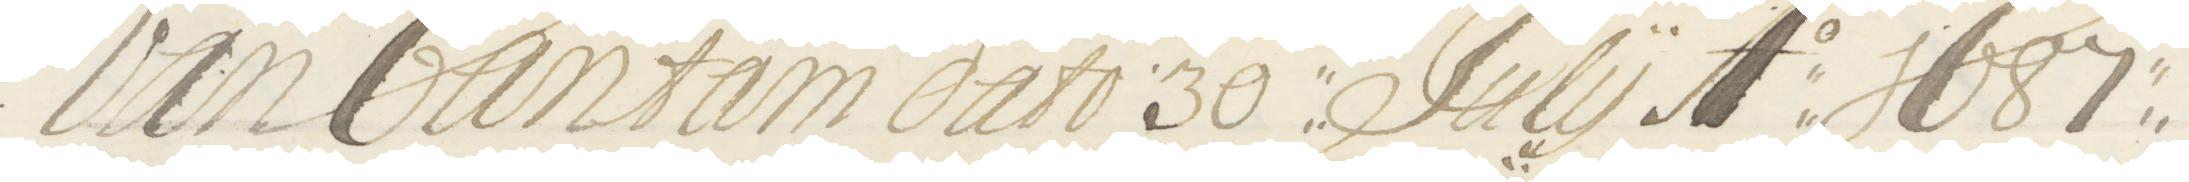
Van Bantam dato 30„“ Julij A„“o 1867„“
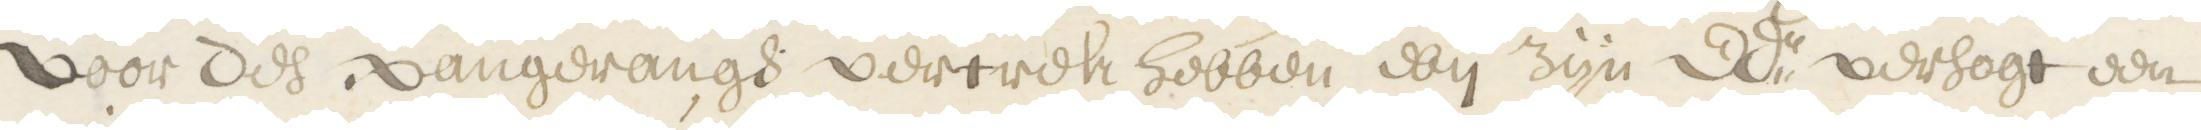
voor des pangerangs vertrek hebben wij zijn Ed„n versogt een
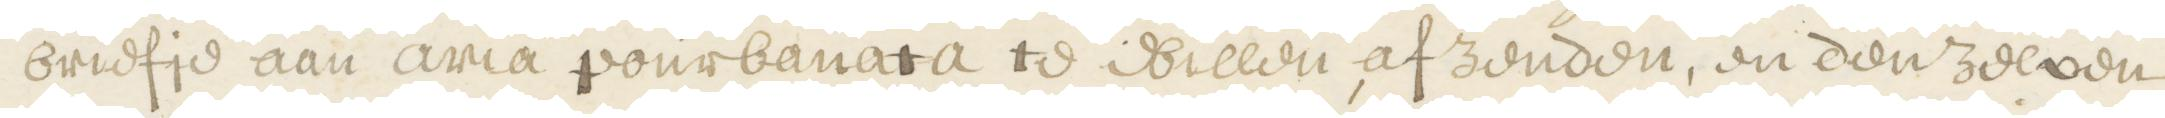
briefje aan aria pourbanata te willen afzenden, en den zelven
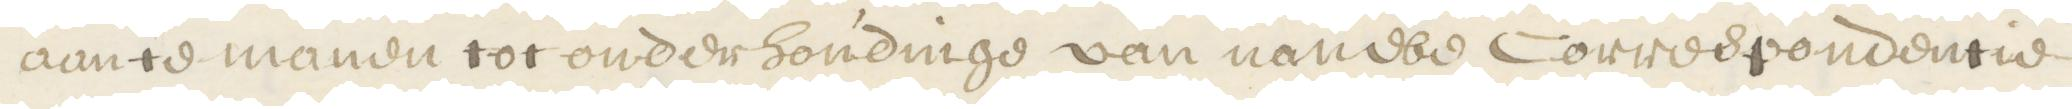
aan te manen tot onderhoudinge van nauwe Correspondentie
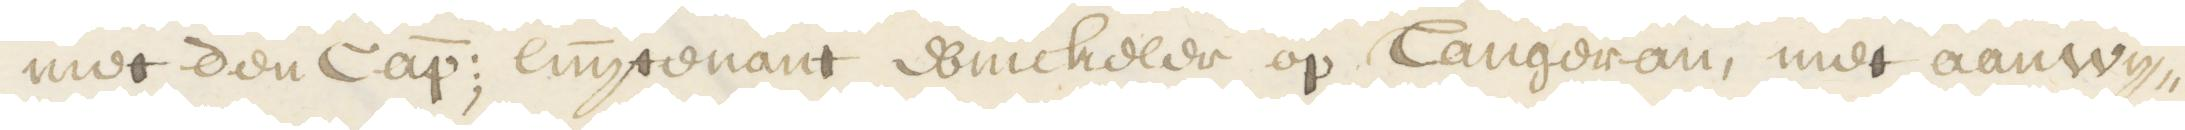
met den Cap: luijtenant winckeler op Tangeran, met aanwij„
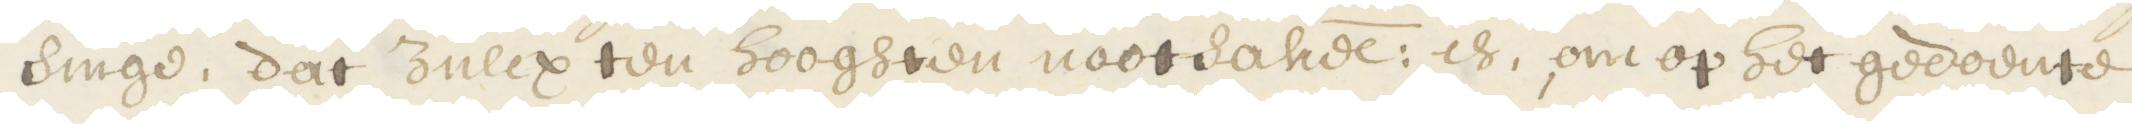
singe, dat zulcx ten hoogsten nootsakel: is, om op het gedoente
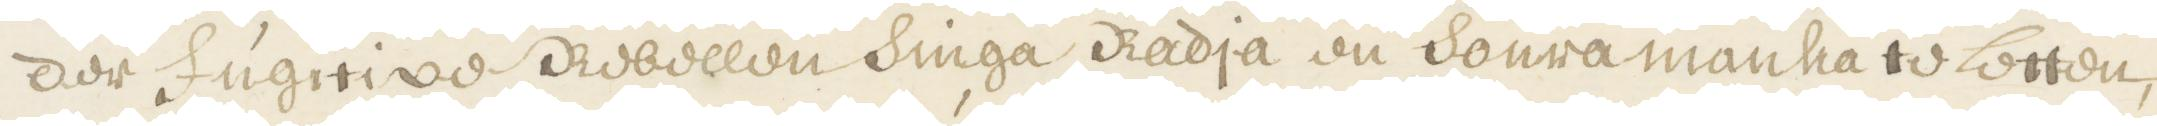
der Fugitive Rebellen Singa Radja en soura manka te letten,
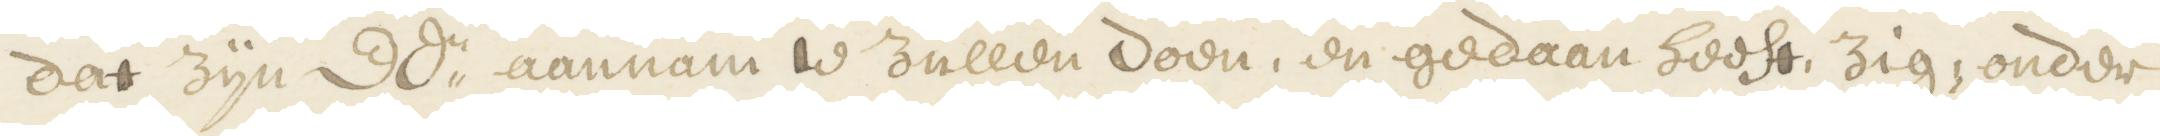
dat zijn Ed„n aannam te zullen doen, en gedaan heeft, zig, onder
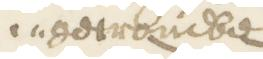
„getrouwe
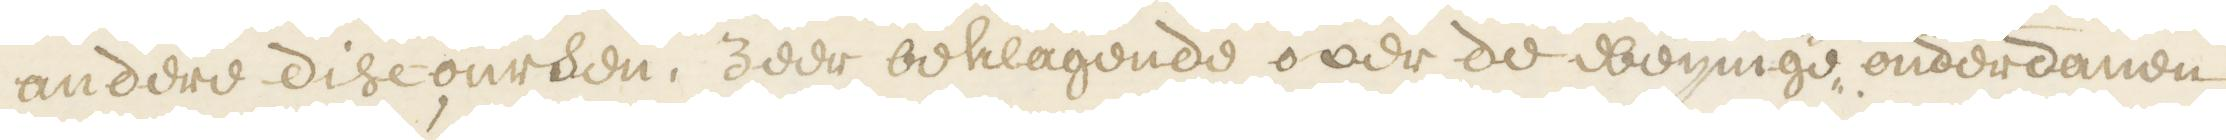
andere discoursen, zeer beklagende over de weijnige„ onderdanen
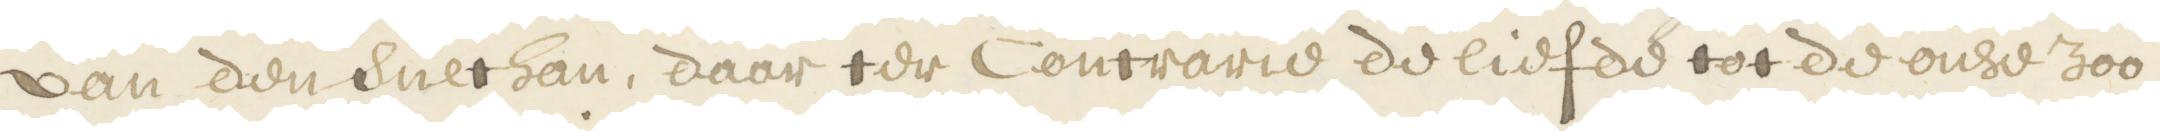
van den sulthan, daar ter Contrarie de liefde tot de onse zoo
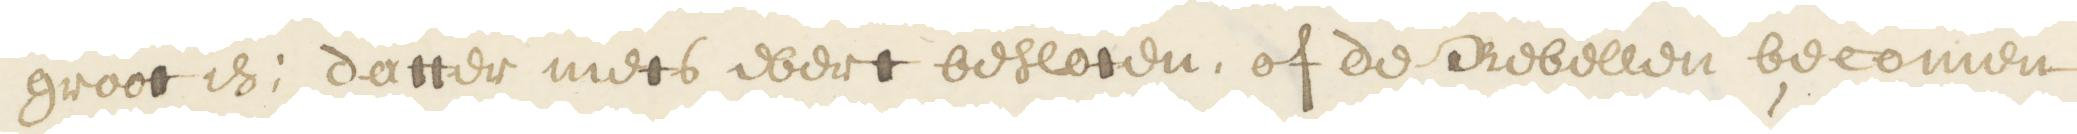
groot is: datter niets wert besloten, of de Rebellen becomen
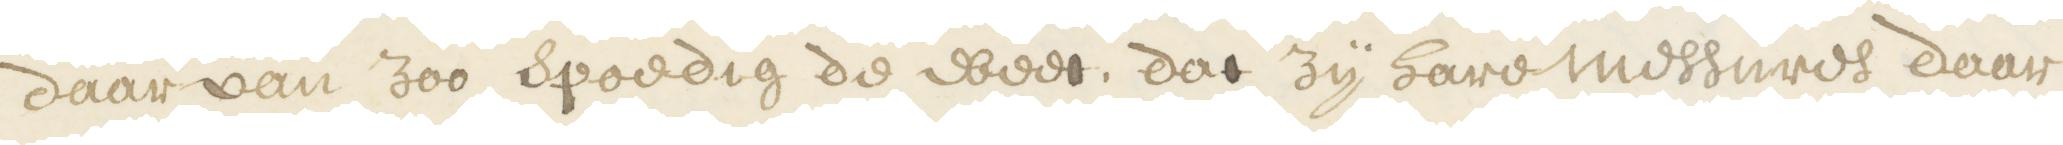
daar van zoo spoedig de weet, dat zij hare Messures daar
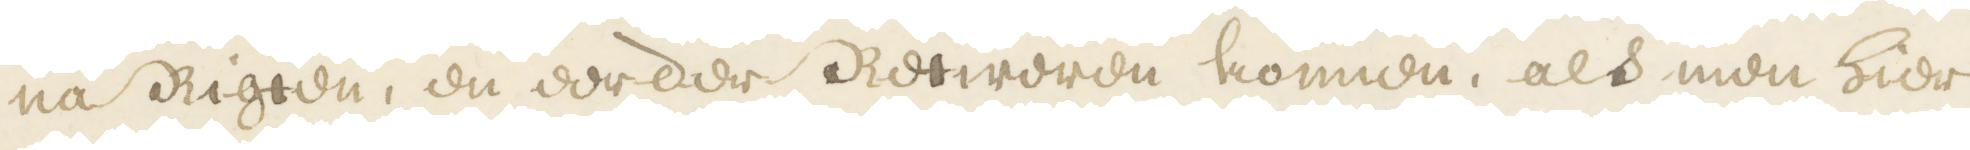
na Rigten, en eerder Retireren konnen, als men hier
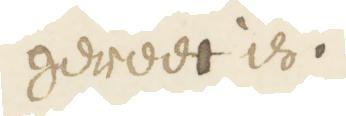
gereet is.
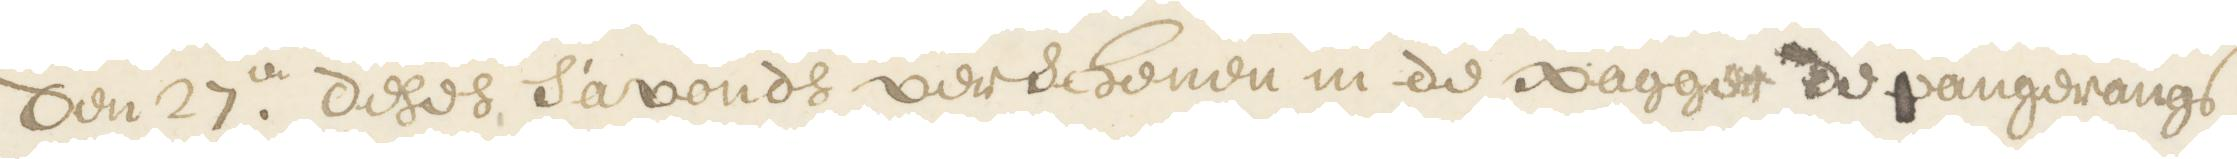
den 27.e deses s'avonds verschenen in de pagger de pangerangs
